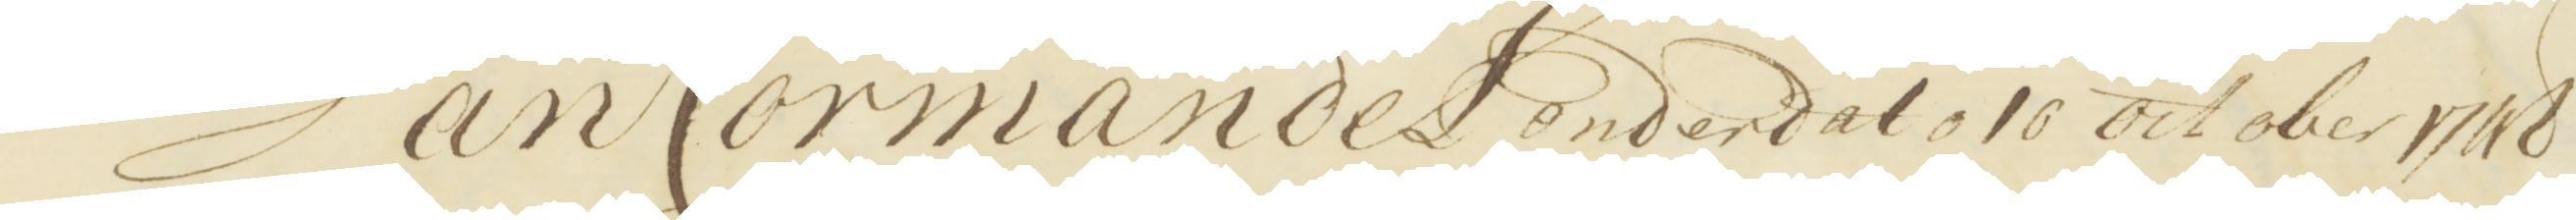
Van Cormandel onderdato 10 october 1748
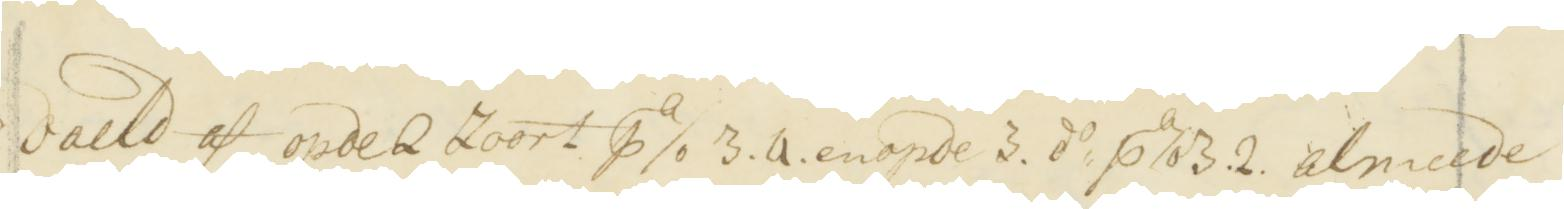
daeld af op de 2 zoort pa/o 3. 4. en opde 3. d„o pa/o 3.2. almeede
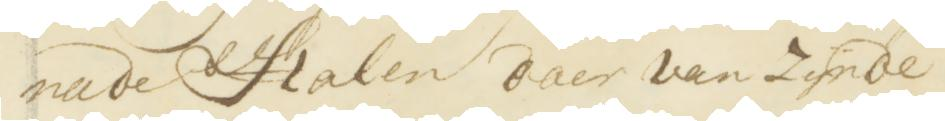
nade Stalen daer van zijnde
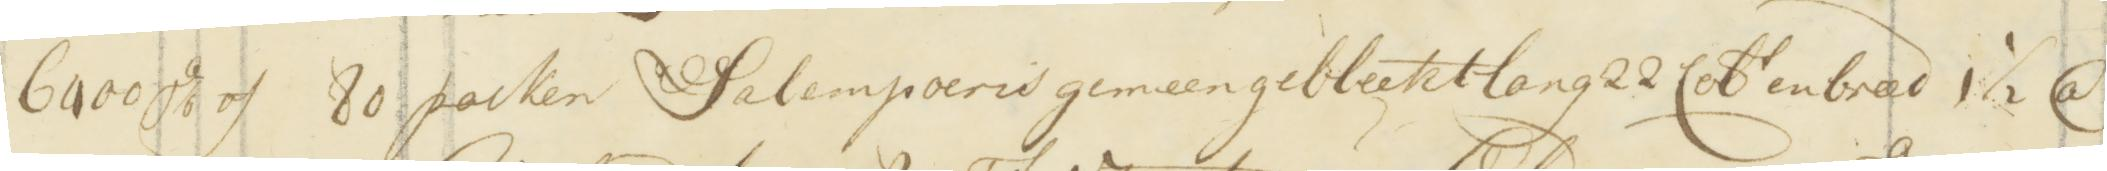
6400 P„s 80 packen Salempoeris gemeen gebleekt lang 22 Cob=s en breed 1½ @
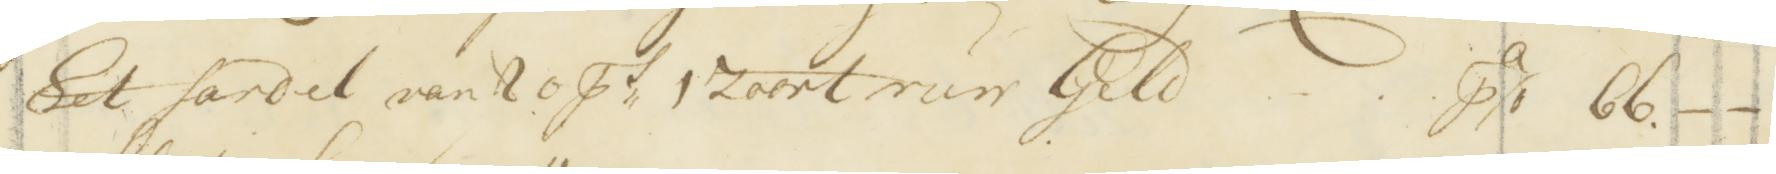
het fardel van 20 p„s 1 zoort ruw Geld . . . . pa/o 66.- -
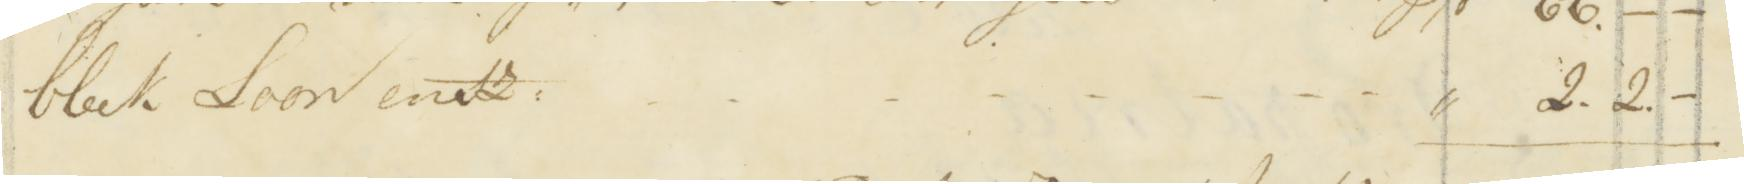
bleek loon ensz: . . - - - - - - „ 2. 2.-
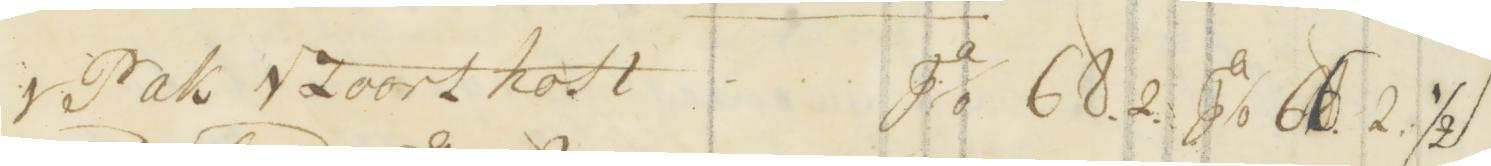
1 Pak 1 zoort kost . . . Pa/o 68.2 Pa/o 66. 2:½
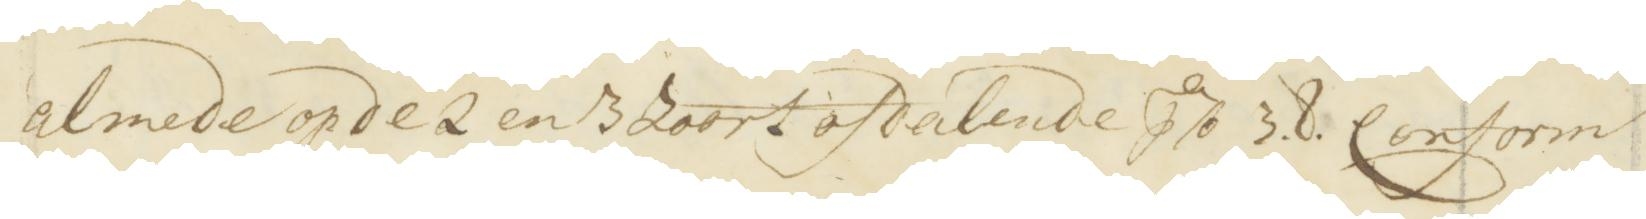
almede op de 2 en 3 zoort of dalende p=a/o 3.8: Conform
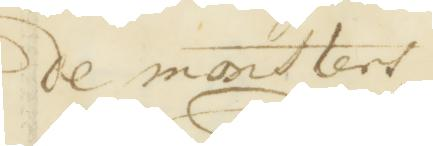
de monsters
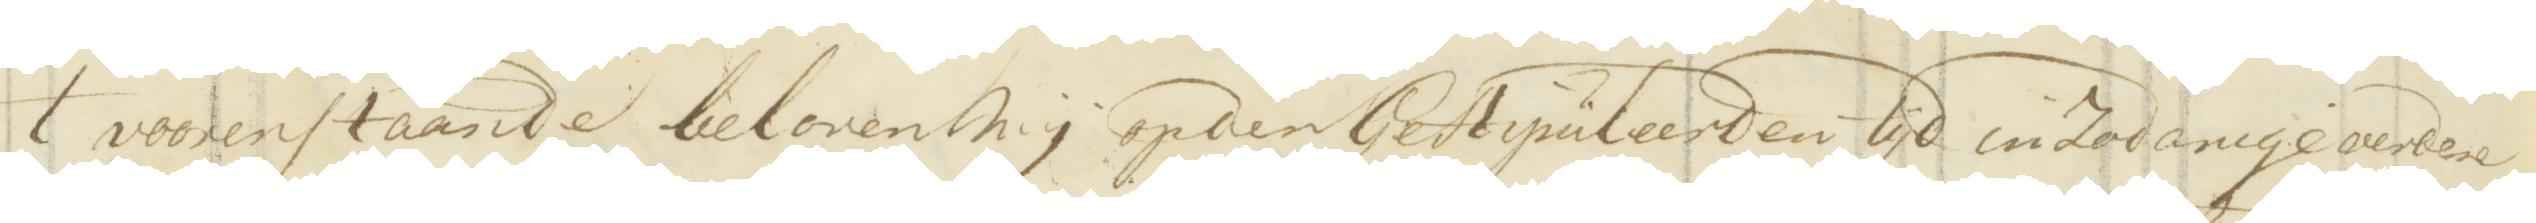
’t voorenstaande beloven wij op den Gestipuleerden tijd in zodanige verdere
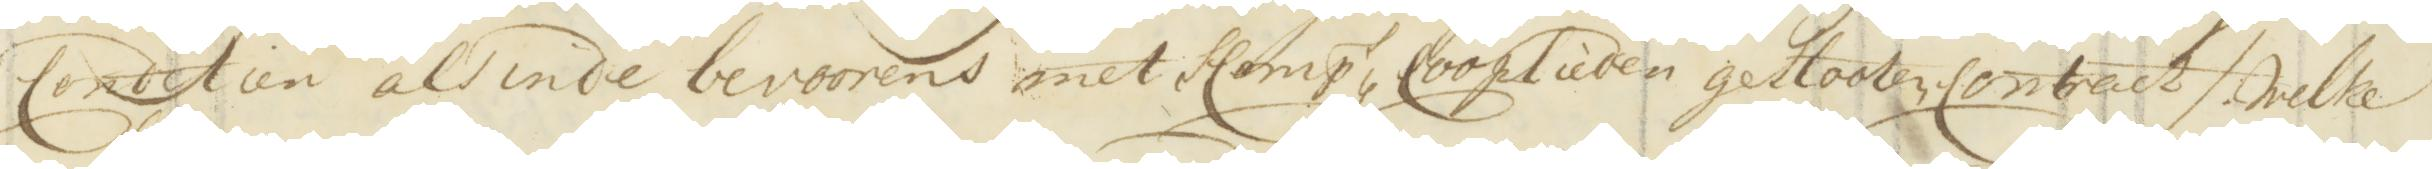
Conditien als in de bevoorens met sComp„s Cooplieden geslooten Contract /. welke
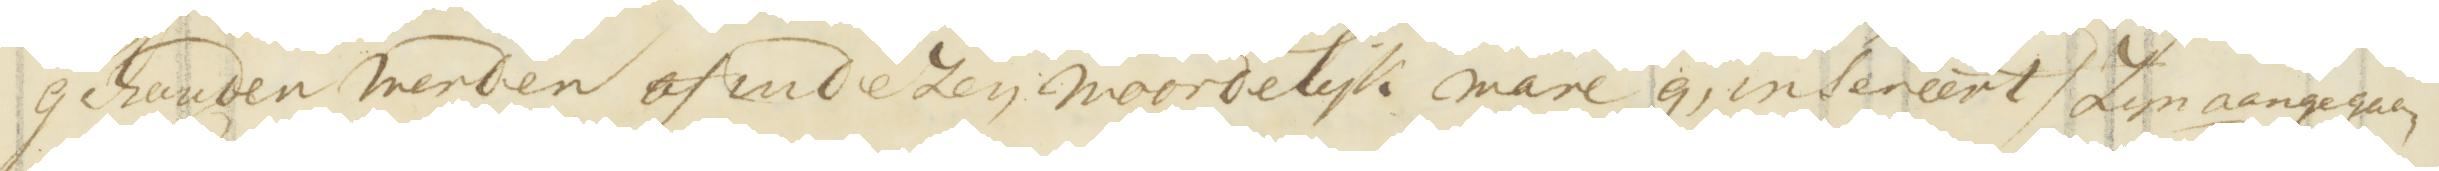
gehouden werden of in dezen woordelijk ware g’inseneert / zijn aangegaen
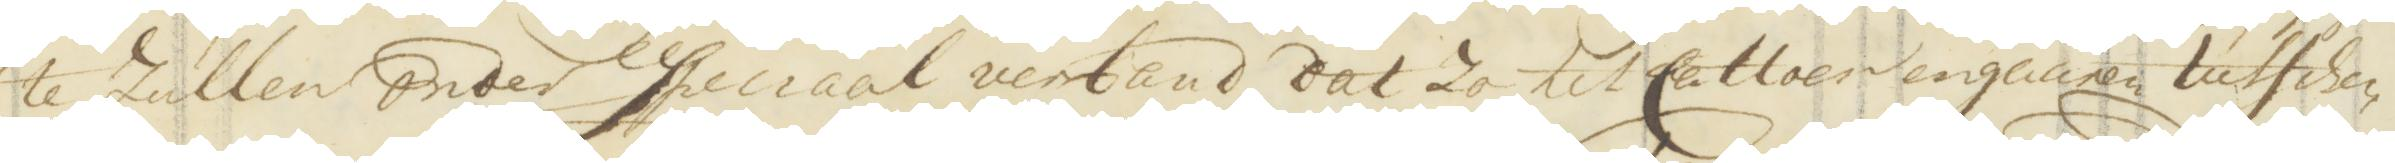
te zullen onder speciaal verband dat zo het Cattoen en gaaren tusschen
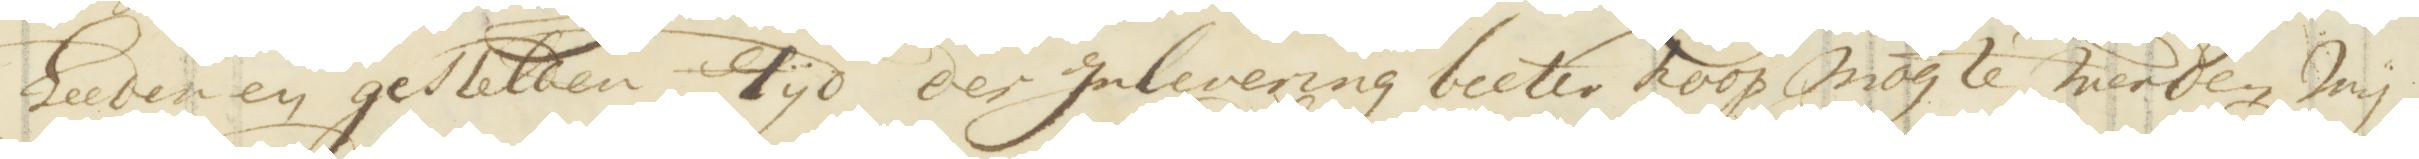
heeden en gestelden tijd der Jnlevering beeter koop mogte werden wij
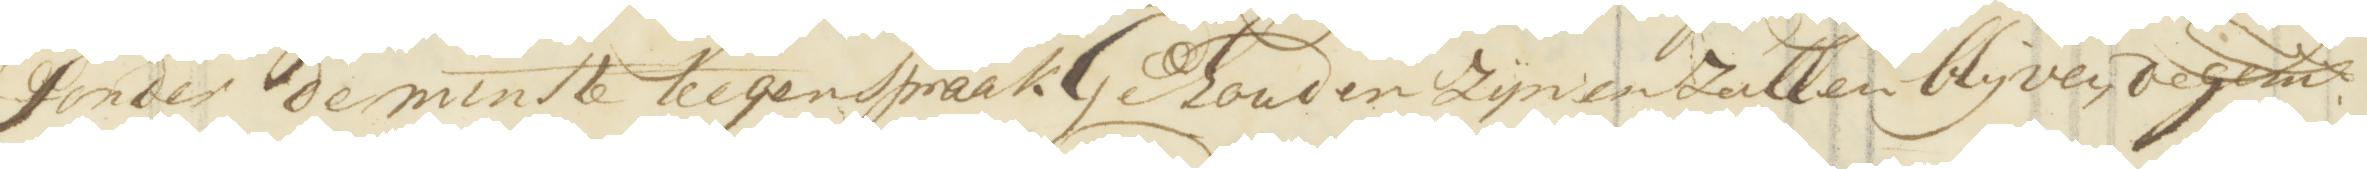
sonder de minste teegenspraak Gehouden zijn en zullen blijven de gem:
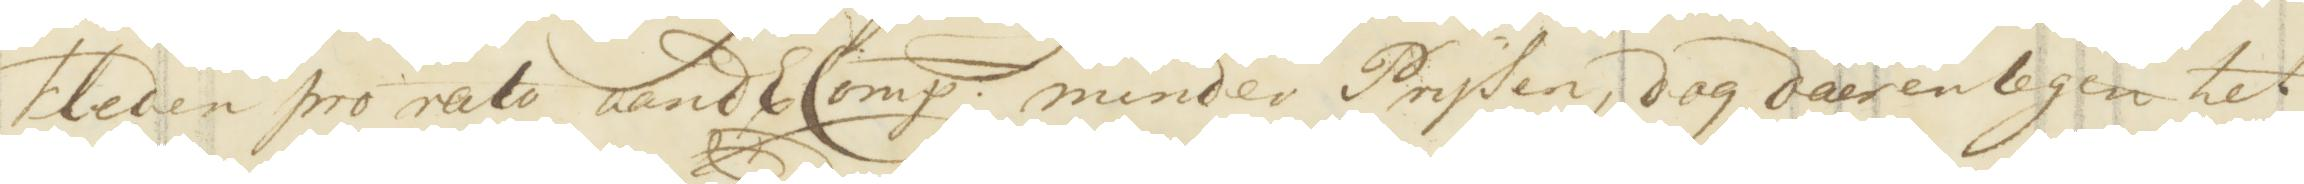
kleden pro rato aan dE Comp: minder Prijsen, dog daer en tegen het
